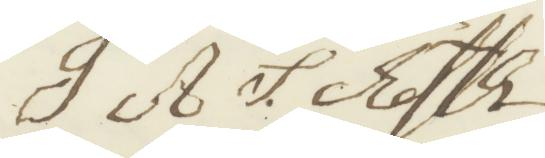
I A S.cheffer
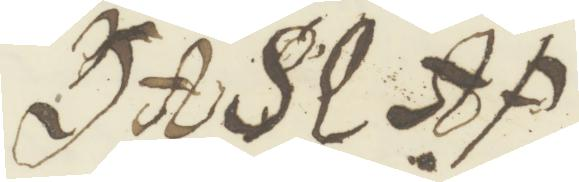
I. A. S.L. Ap
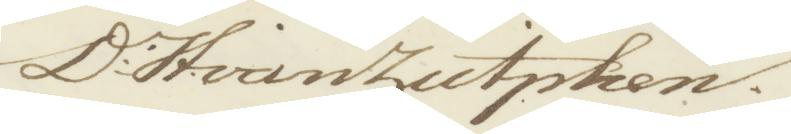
D: H.van Zutphen.
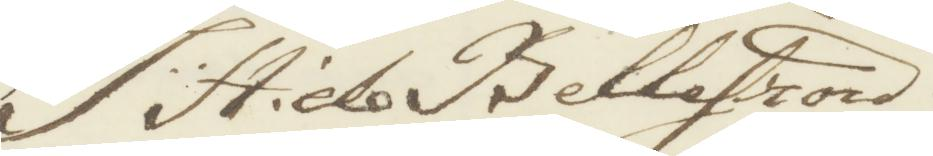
J: H: de Bellefroid
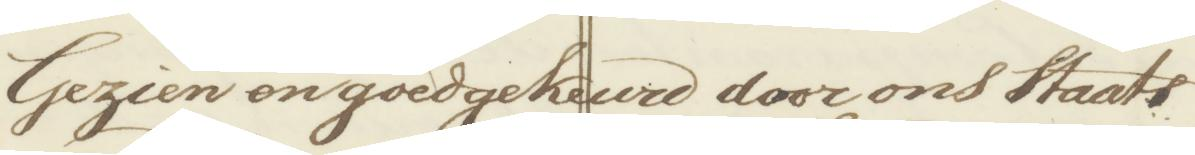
Gezien en goedgekeurd door ons staats„
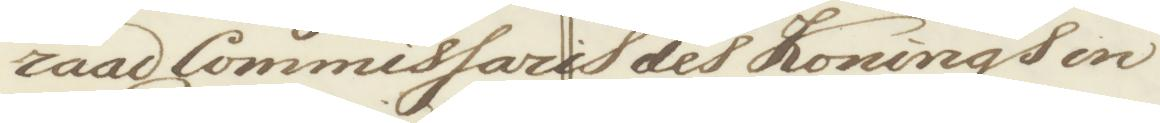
raad Commissaris des Konings in
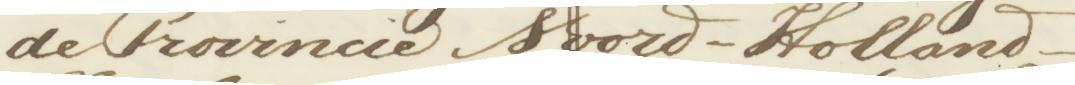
de Provincie Noord-Holland-
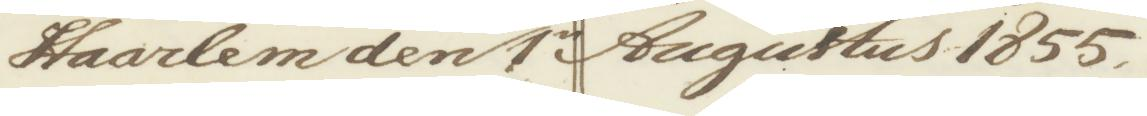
Haarlem den 1n Augustus 1855.
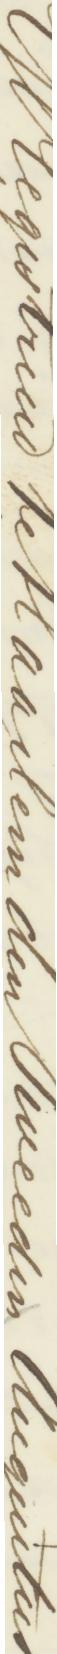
Geregistreerd te Haarlem den Twee den Augustus
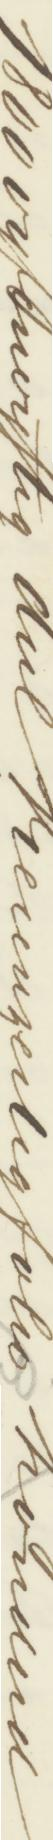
1800 vyf envyftig deel Vierenzestig folio honderd
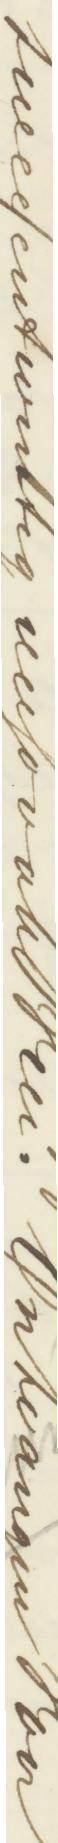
twee en twintig verso vak vier. Ontvangen voor
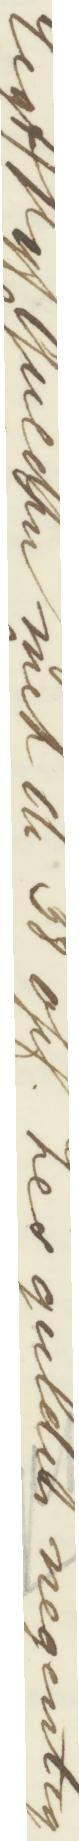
regt vyf gulden met de 38 opC. Zes gulden negentig
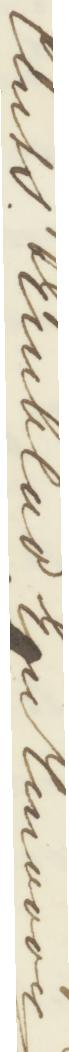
Cents. Een blad Een renvooi
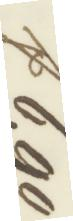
f 6,90.
